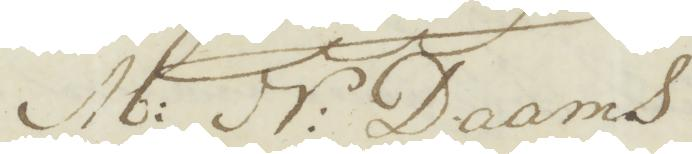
Ab: N: Daams
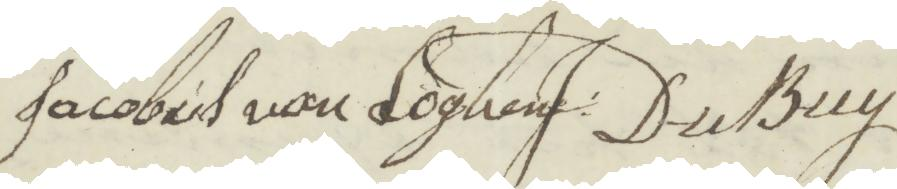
Jacobus van Loghem Du Buy
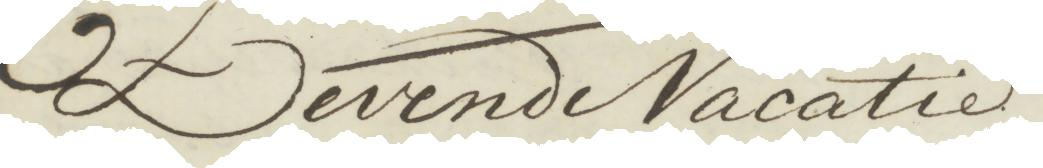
Zevende Vacatie
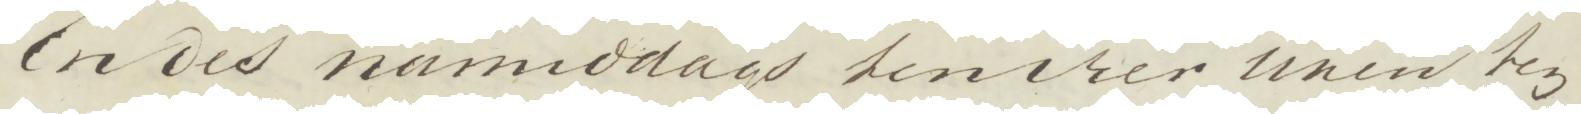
En des namiddags ten vier uren, ten
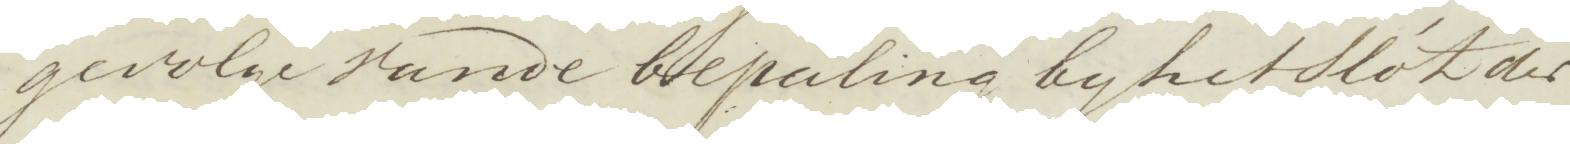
gevolge vande bepaling by het slot der
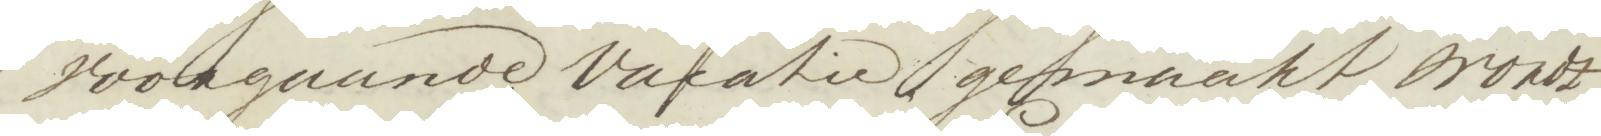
voorgaande Vacatie gemaakt wordt
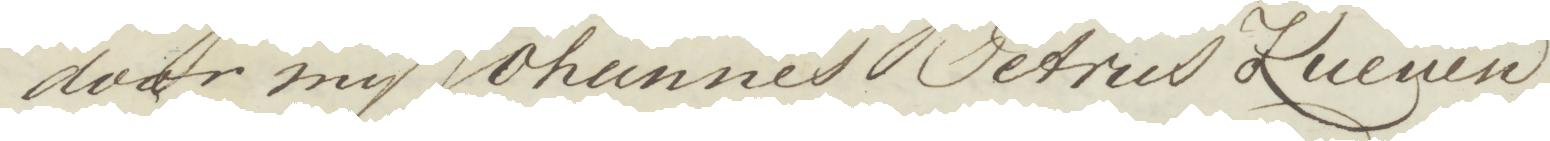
door my Johannes Petrus Kuenen,
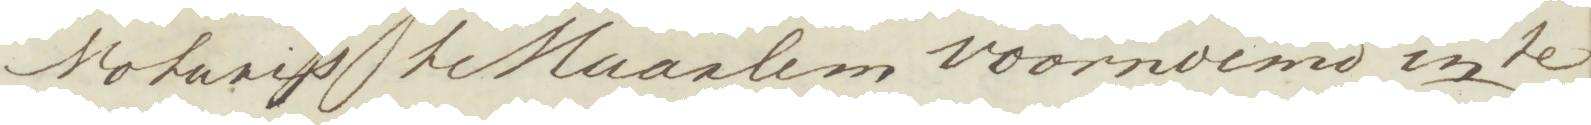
Notaris te Haarlem voornoemd in te
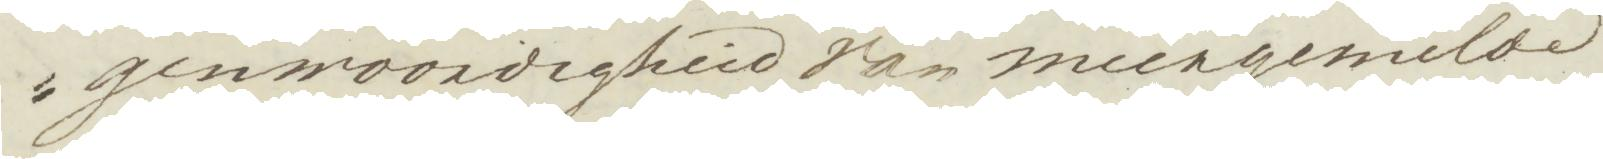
=genwoordigheid van meergemelde
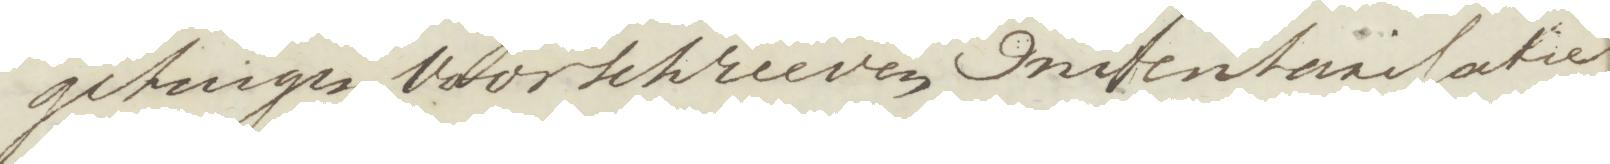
getuigen voorschreeven Inventarisatie
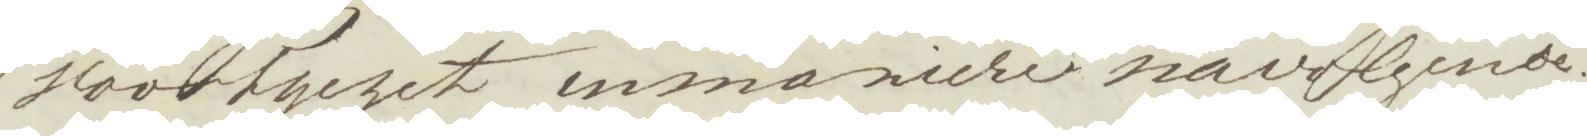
voortgezet inmaniere navolgende;
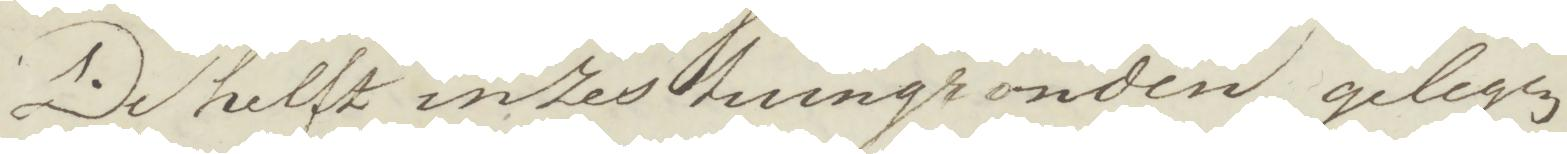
De helft in zes tuingronden, gelegen
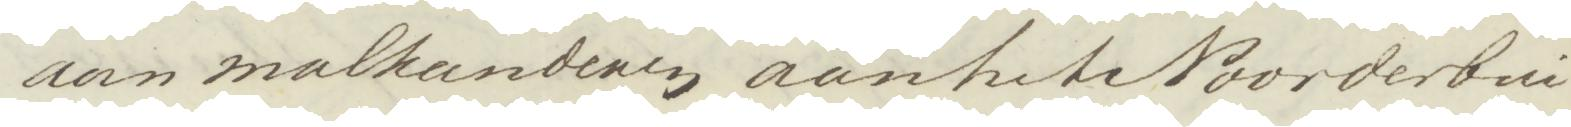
aan malkanderen aan het Voorderbui
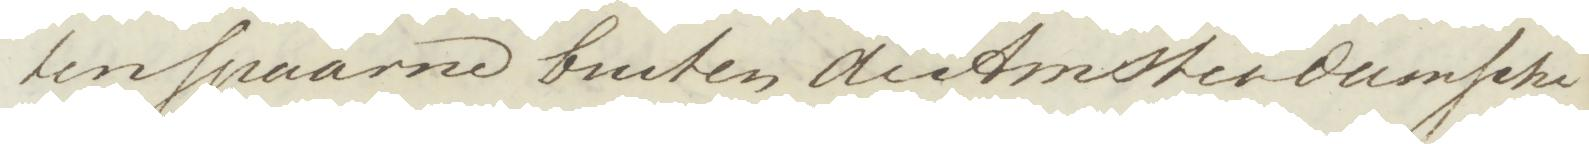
ten Spaarne buiten de Amsterdamsche
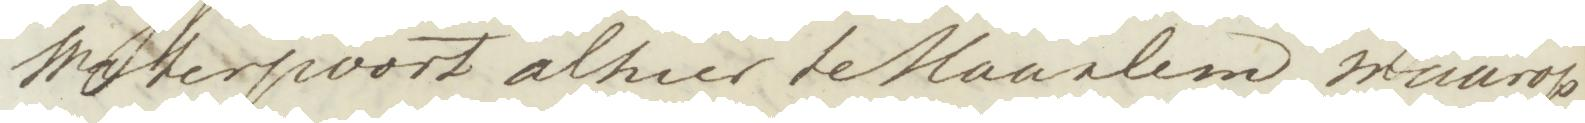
Waterpoort alhier te Haarlem, waarop
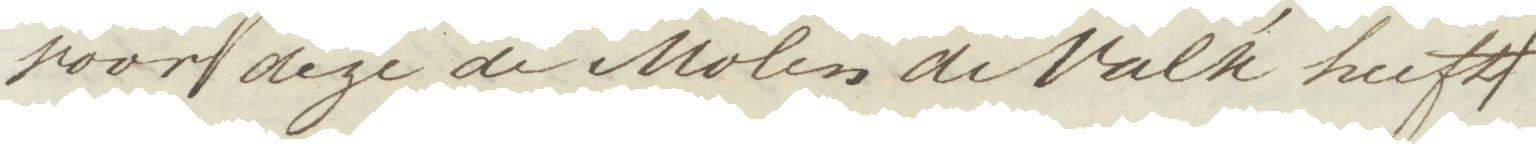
voor deze de Molen de Valk heeft
